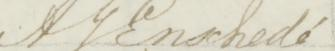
A J Enschedé
